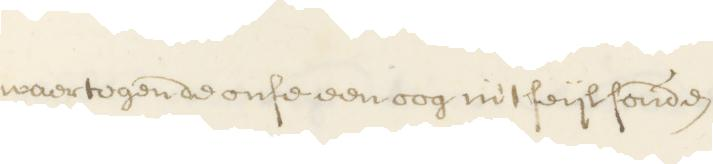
waertegende onse een oog int seijl souden
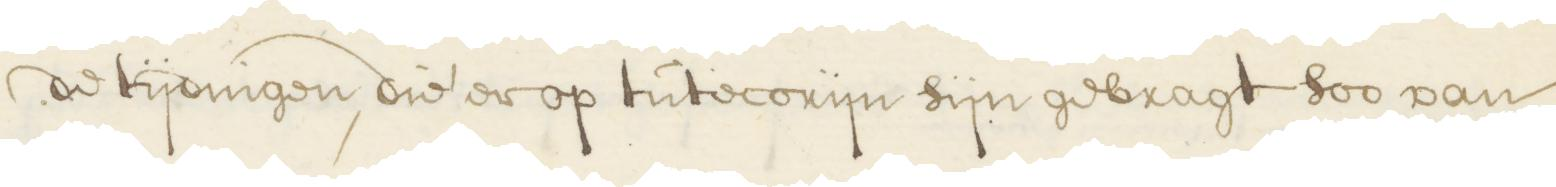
de tijdingen, die er op tutecorijn sijn gebragt soo van
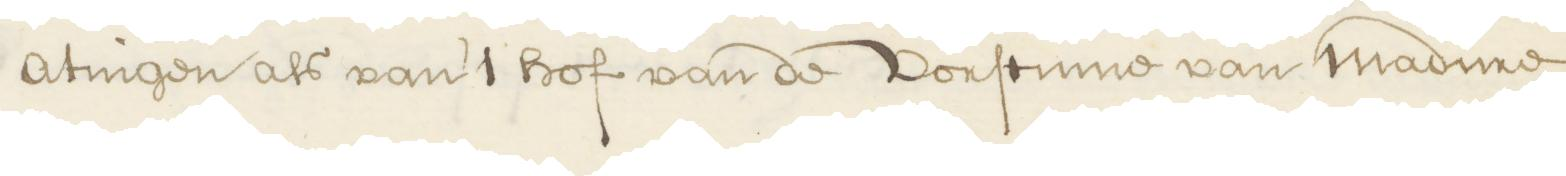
atingen als van’t hof van de Vorstinne van Madure,
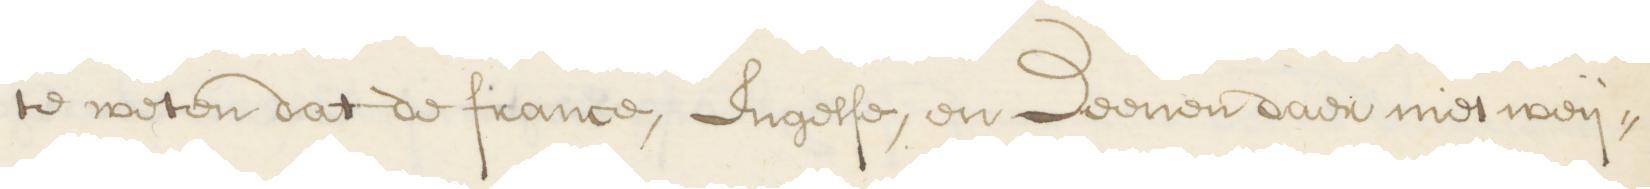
te weten dat de france, Engelse, en Deenen daer niet weij„
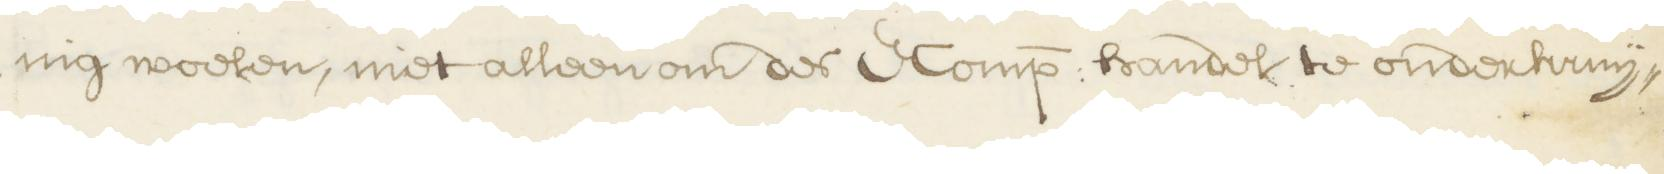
„nig woelen, niet alleen om des E Comp: handel te onderkruij„
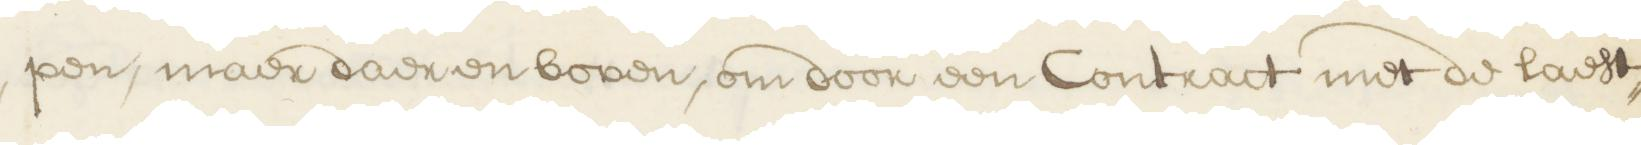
„pen, maer daer en boven, om door een Contract met de laest„
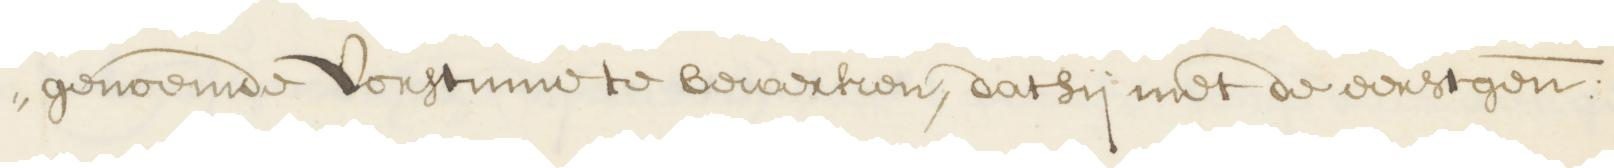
„ genoemde Vorstinne te bewerken, dat sij met de eerstgen:
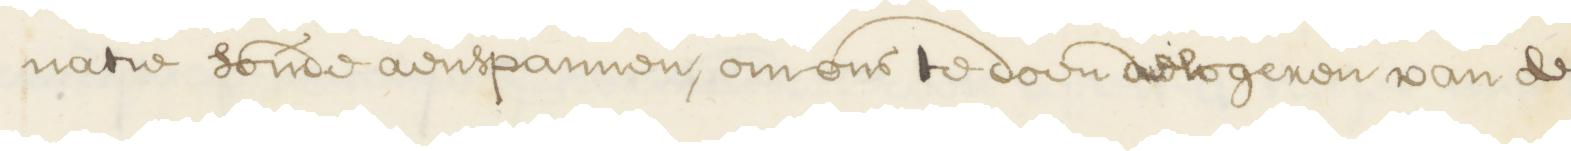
natie soude aenspannen, om ons te doen delogeren van de
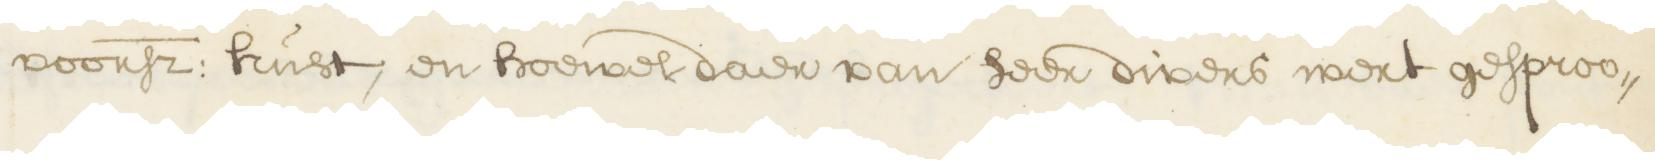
voorsr: kust, en hoewel daer van heer divers wert gesproo„
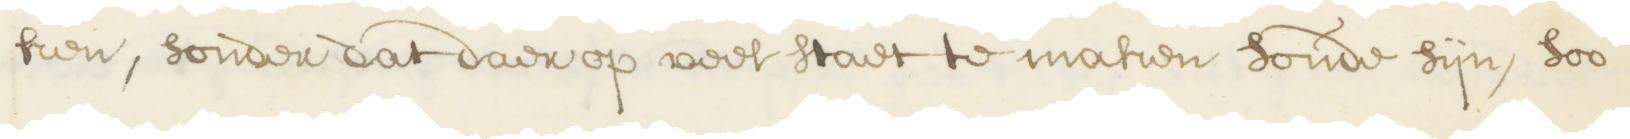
ken, sonder dat daer op veel staet te maken soude sijn, soo
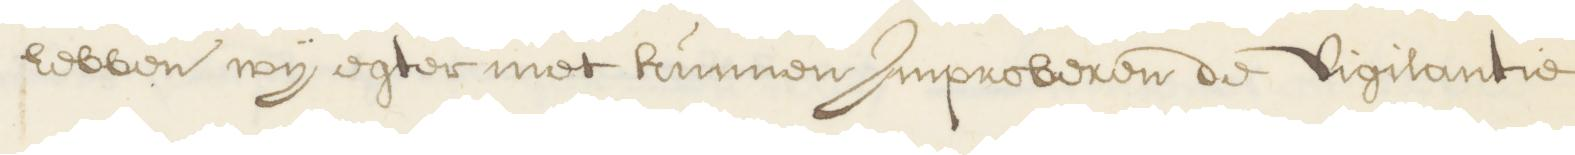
hebben wij egter niet kunnen Improberen de Vigilantie
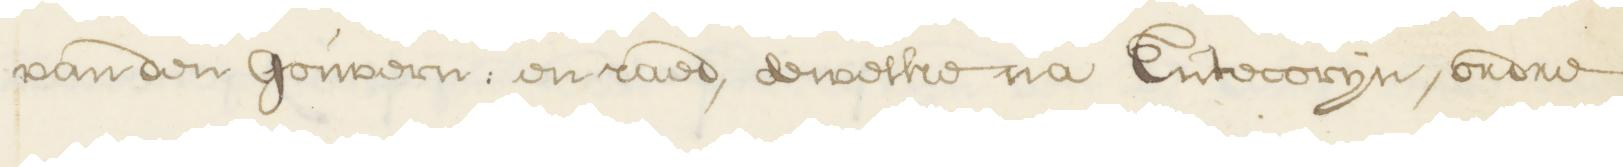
van den gouvern:r en raed, dewelke na Tutecorijn, ordre
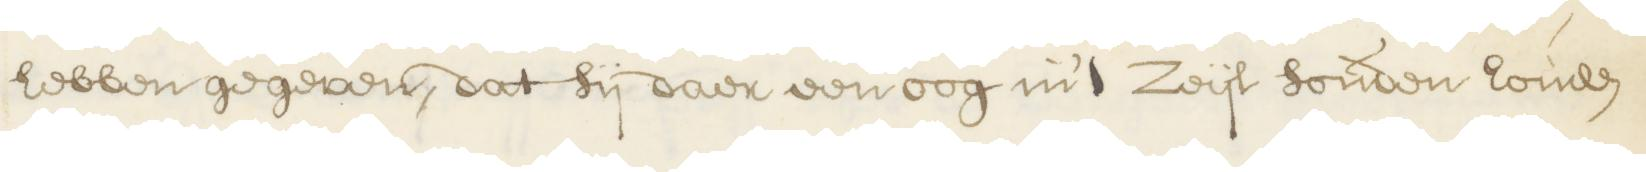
hebben gegeven, dat sij daer een oog in ’t zeijl souden houden
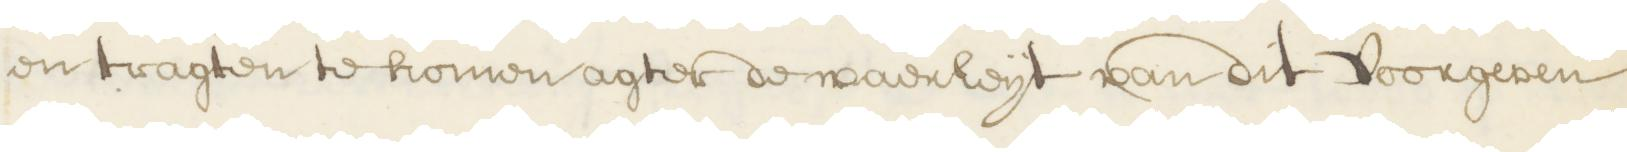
en tragten te komen agter de waerheijt van dit Voorgeven
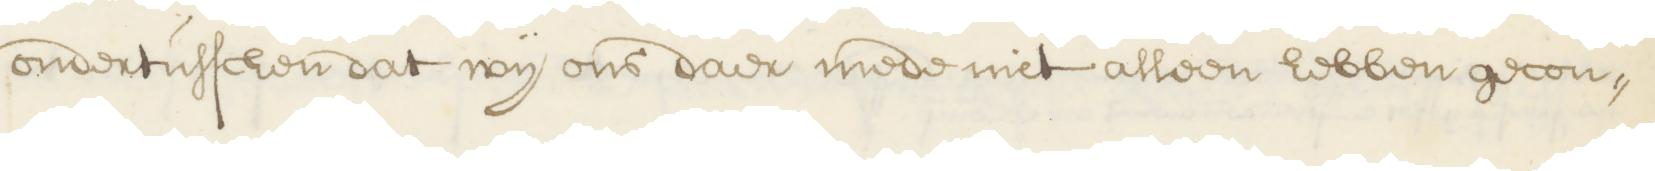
ondertusschen dat wij ons daer mede niet alleen hebben gecon„
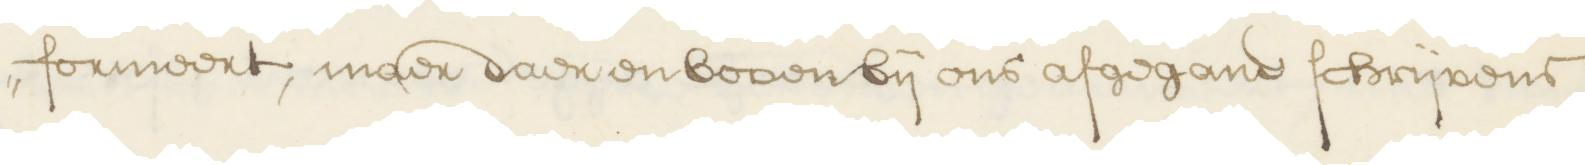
„formeert, maer daer en boven bij ons afgegane schrijvens
